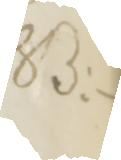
83:–
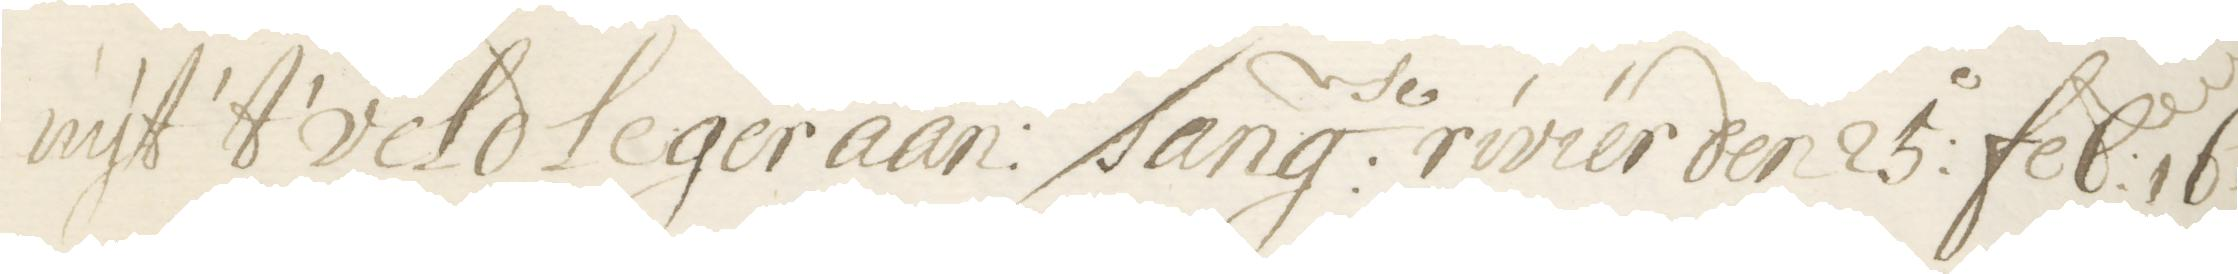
uijt 't veld leger aan: Tang:se rivier den 25:e feb: 16
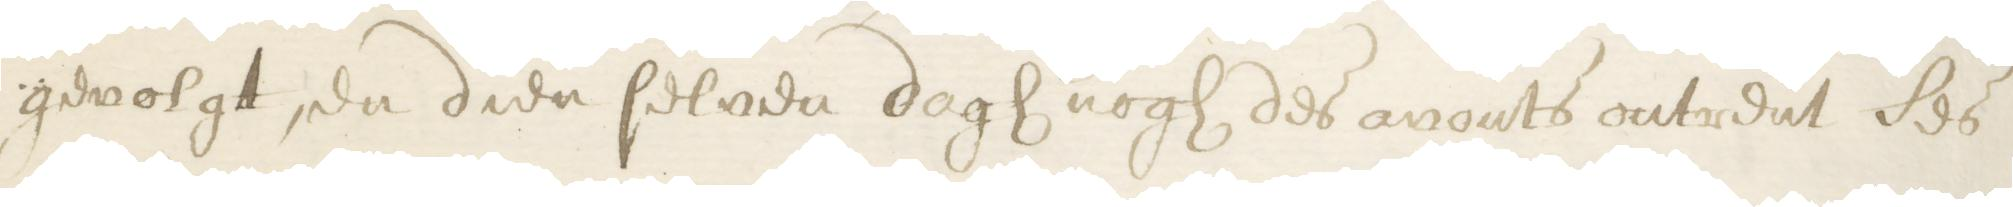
gevolgt, en dien selven dagh nogh des avonts ontrent ses
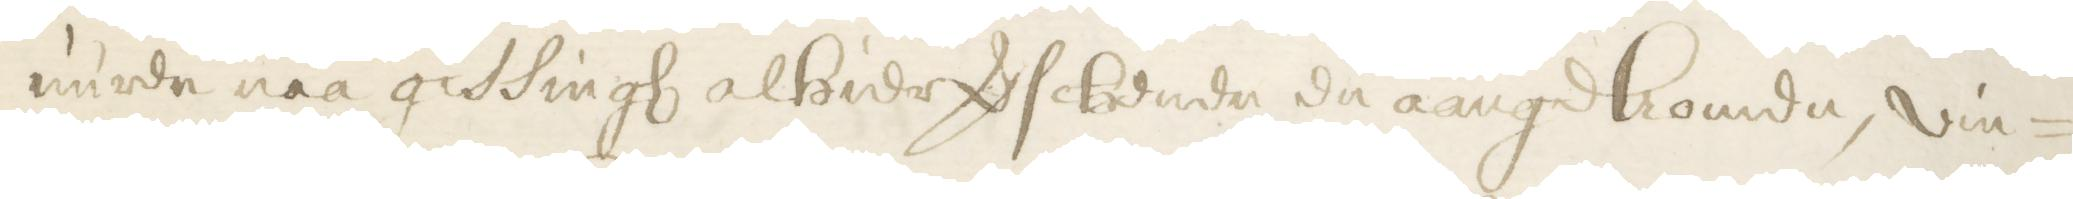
uuren naa gissingh alhier verschenen en aangekomen, vin=
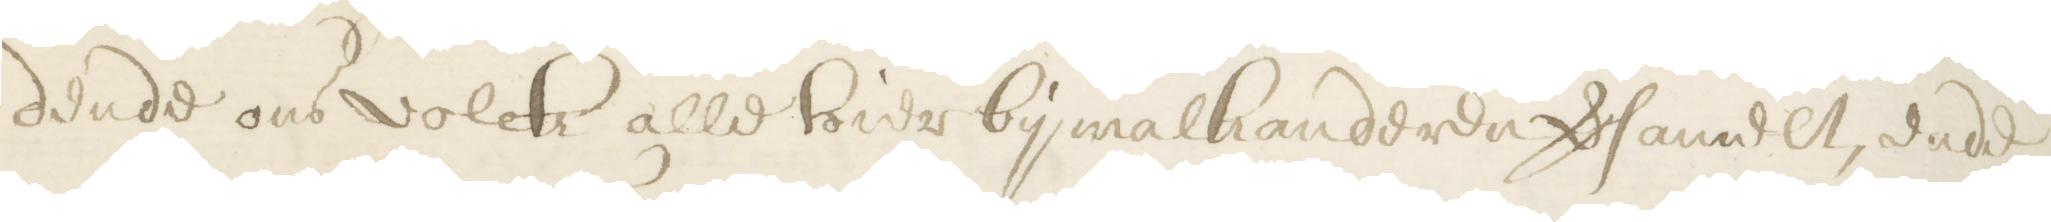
dende ons volck alle hier bij malkanderen versamelt, ende
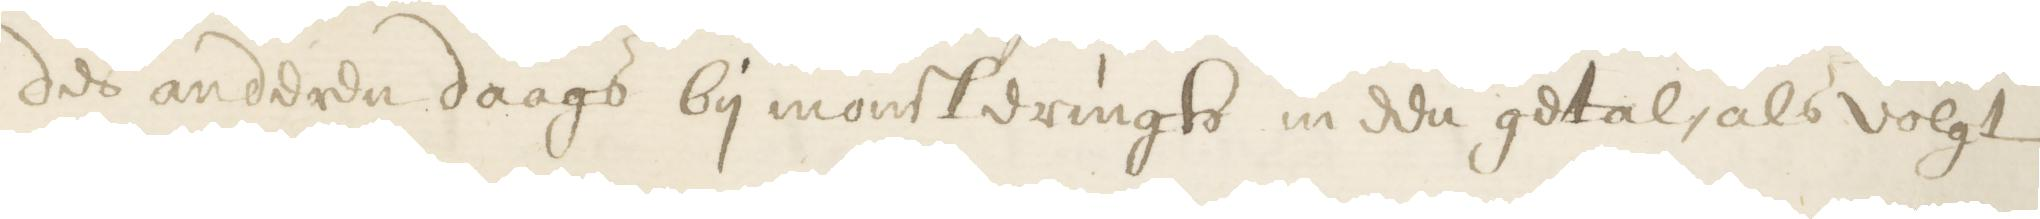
des anderen daags bij monsteringh in een getal, als volgt
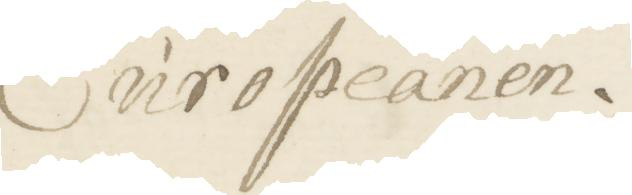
Europeanen.
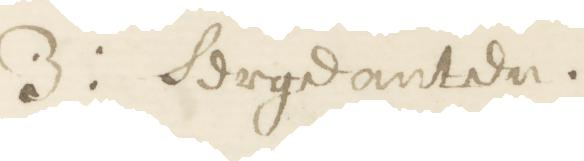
3: sergeanten.
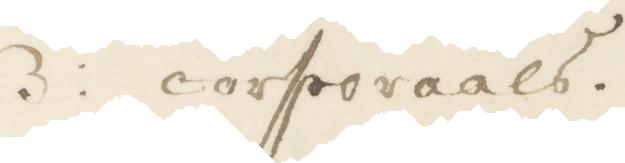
3. corporaals.
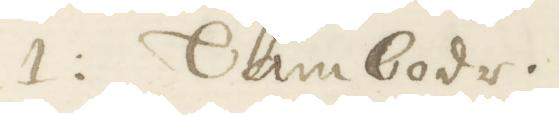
1: Tamboer.
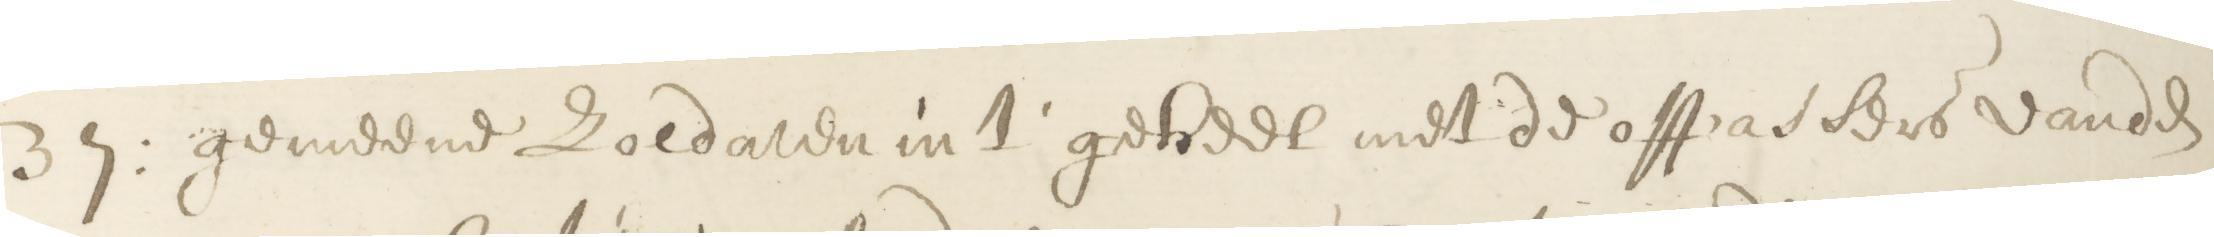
37: gemeene zoldaten in 1' geheel met de oppassers van den
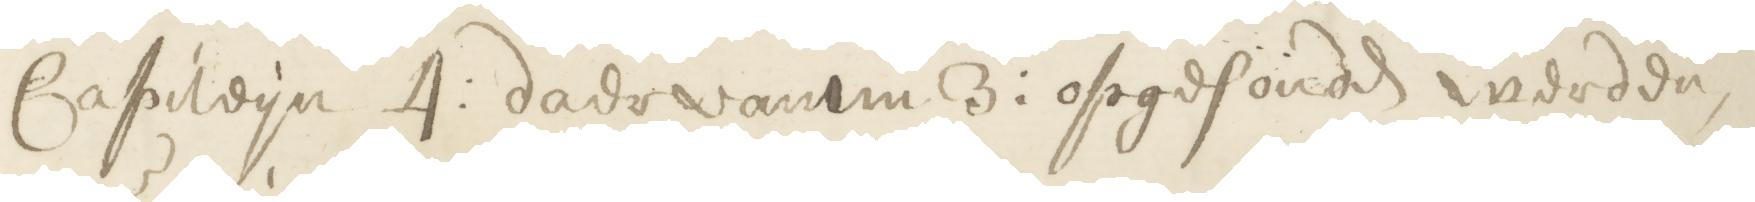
Capiteijn 4: daer van im 3: opgesonden werden,
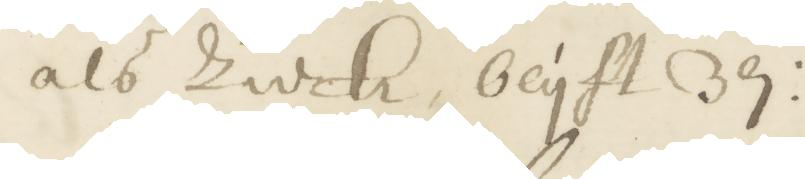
als zieck, blijft 37:
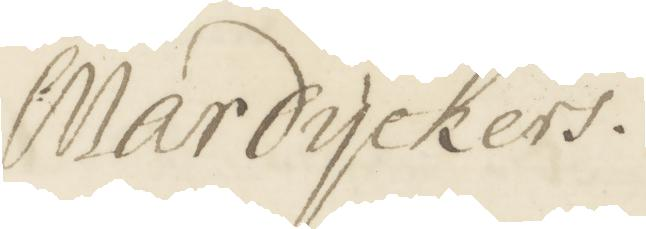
Mardijckers.
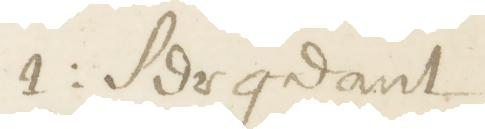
1: Sergeant
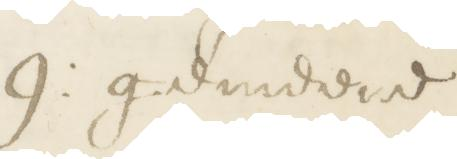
9: gemeene
